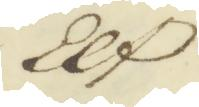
Elf
